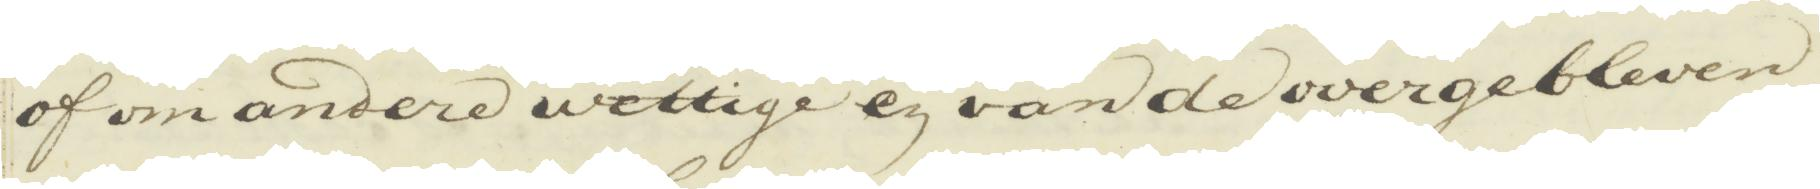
of om andere wettige en van de overgebleven
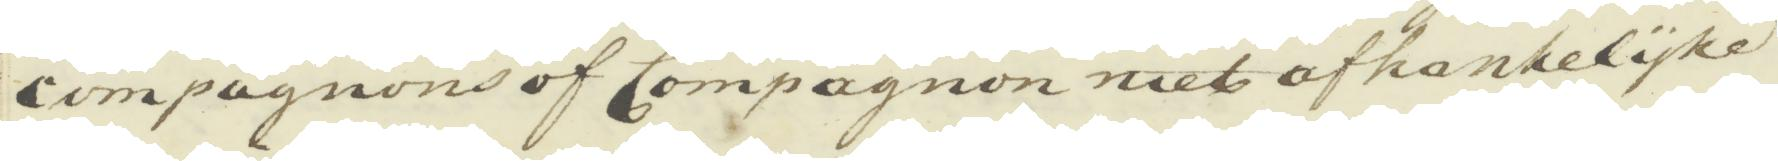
Compagnons of Compagnon niet afhankelijke
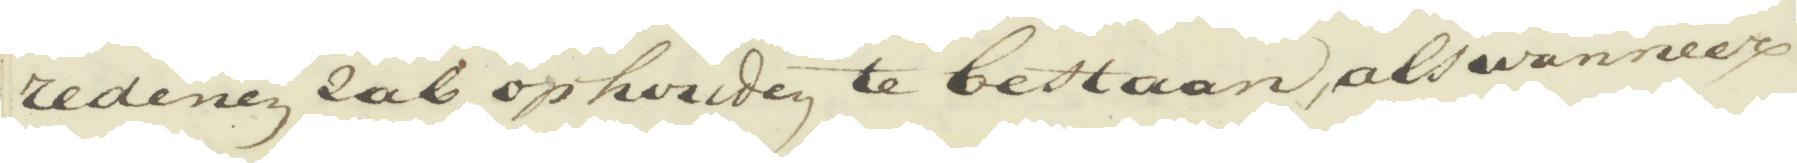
redenen zal ophouden te bestaan, als wanneer
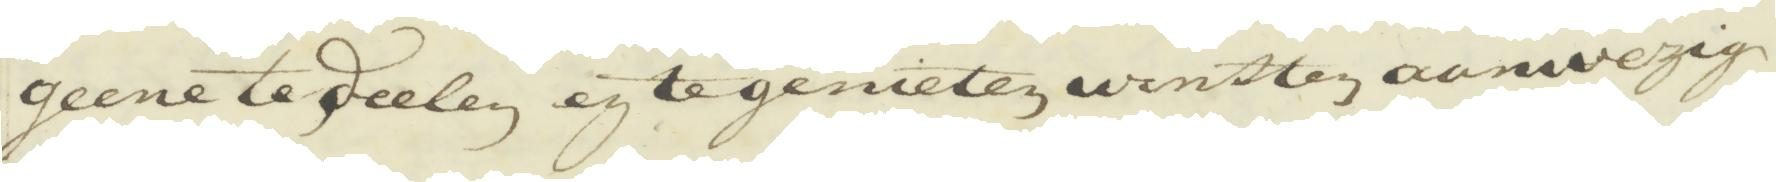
geene te deelen en te genieten winsten aanwezig
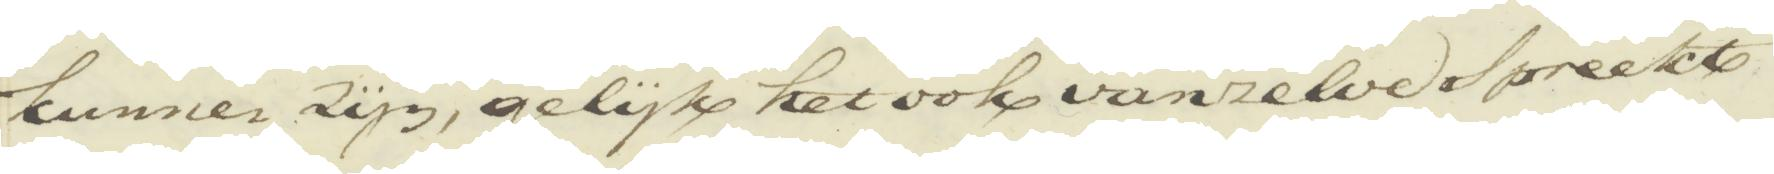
kunnen zijn, gelijk het ook vanzelve spreekt
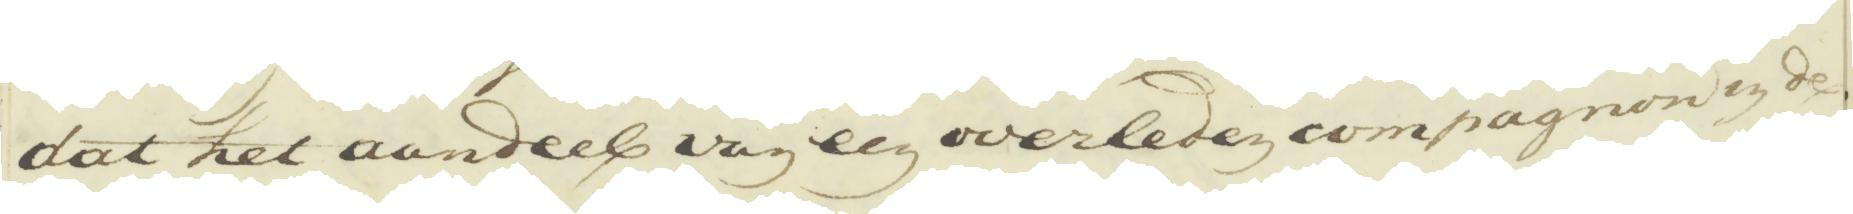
dat het aandeel van een overleden compagnon en de
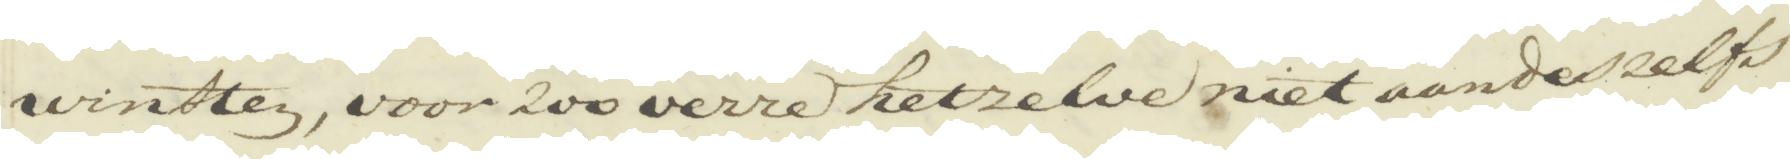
winsten, voor zoo verre hetzelve niet aan deszelfs
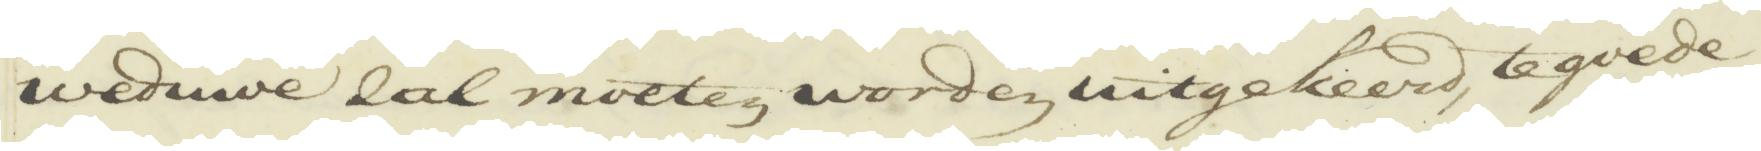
weduwe zal moeten worden uitgekeerd, te goede
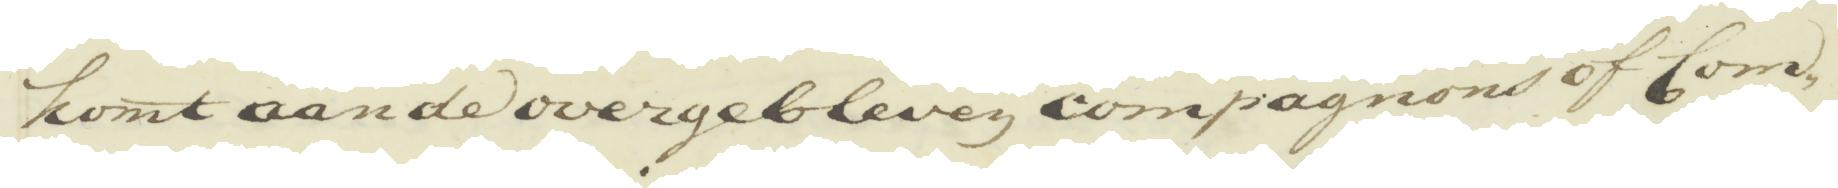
komt aan de overgebleven compagnons of Com„
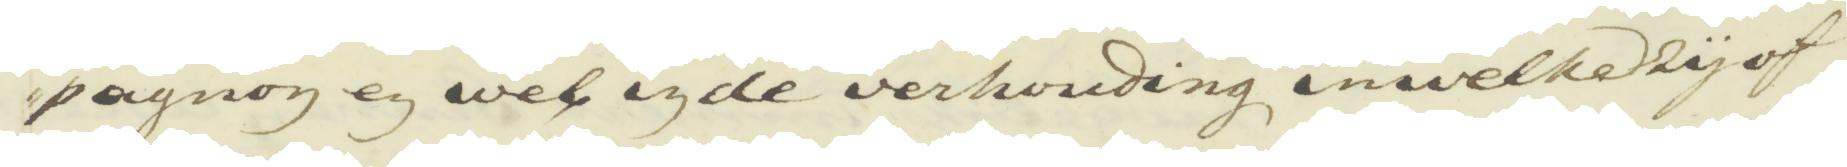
„pagnon en wel in de verhouding inwelke zij of
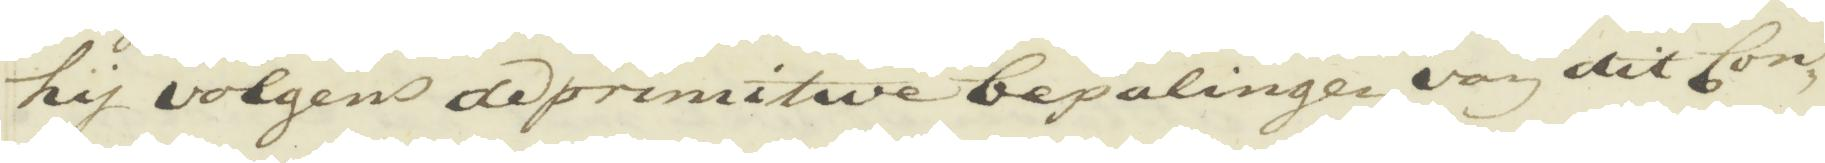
hij volgen de primitive bepalingen van dit Con„
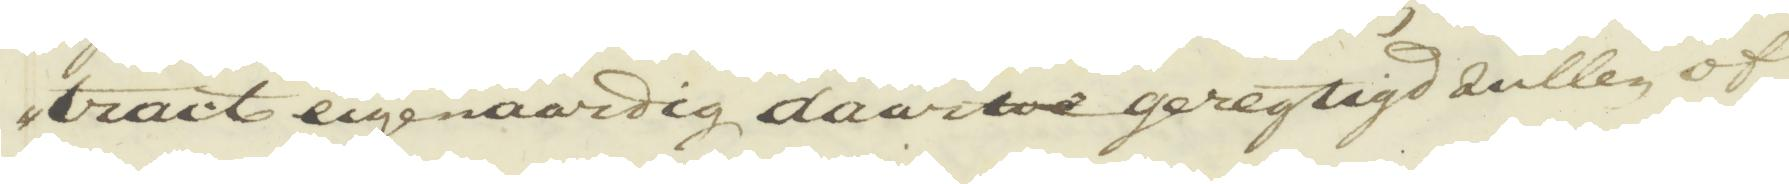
„tract eigenaardig daartoe geregtigd zullen of
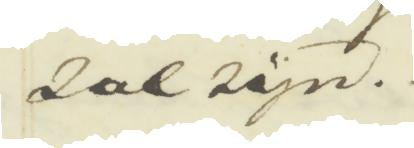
zal zijn.
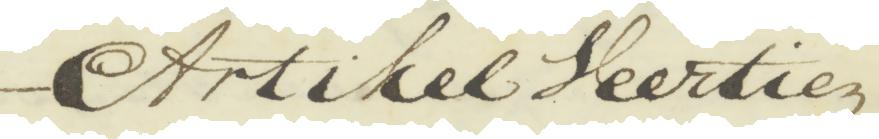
— Artikel Veertien
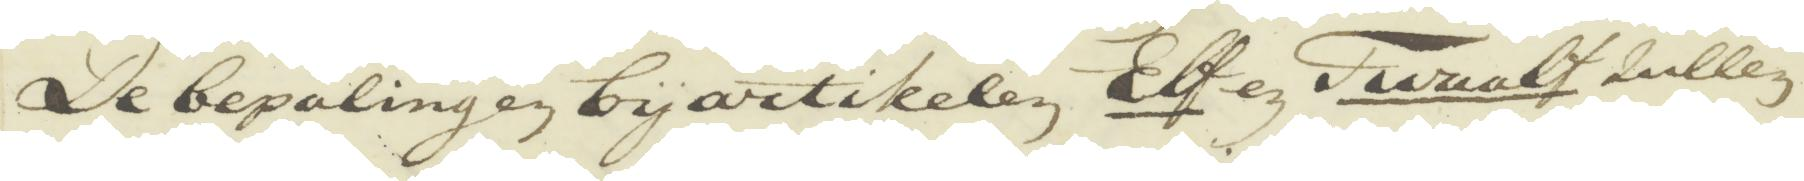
De bepalingen bij artikelen Elf en Twaalf zullen
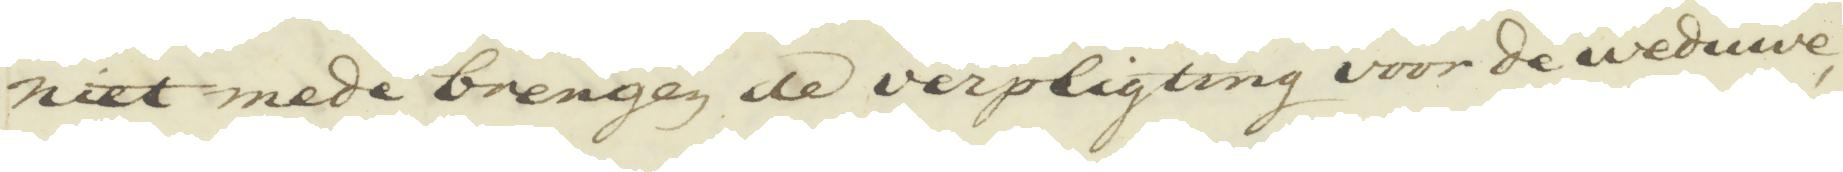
niet mede brengen de verpligting voor de weduwe,
